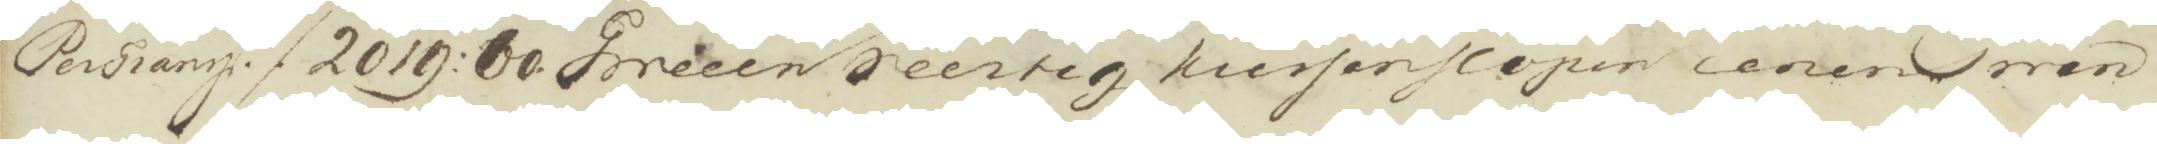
Per Transp.t. ƒ 2019:80. Tweeen veertig kussenslopen eenen Twin
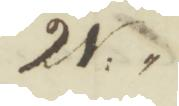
21.„
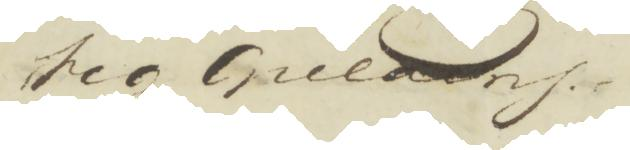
,tig Guldens.-
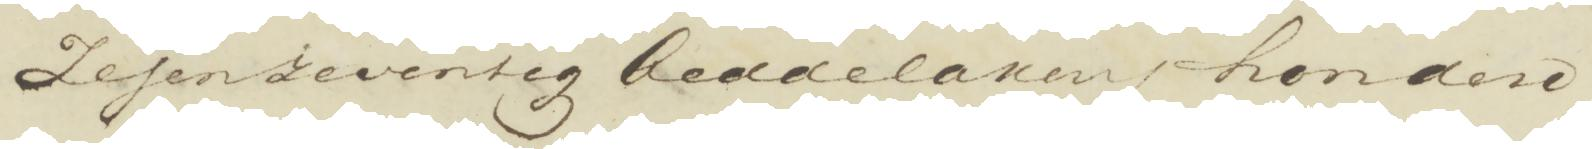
Zesen zeventig beddelakens honderd
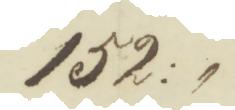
152: „
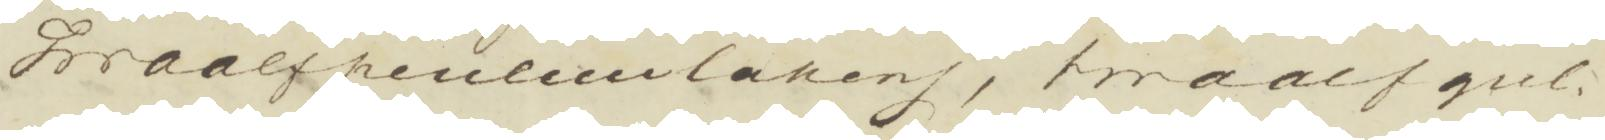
Twaalf peuluwlakens, twaalf gul:
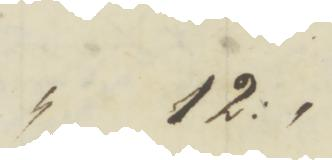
„ 12: „
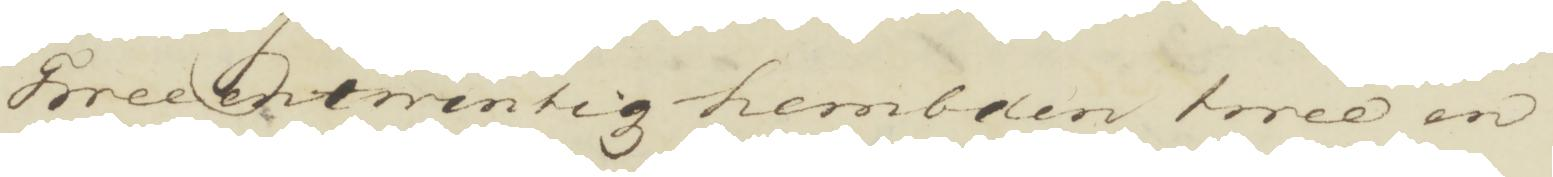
Tweeentwintig hembden twee en
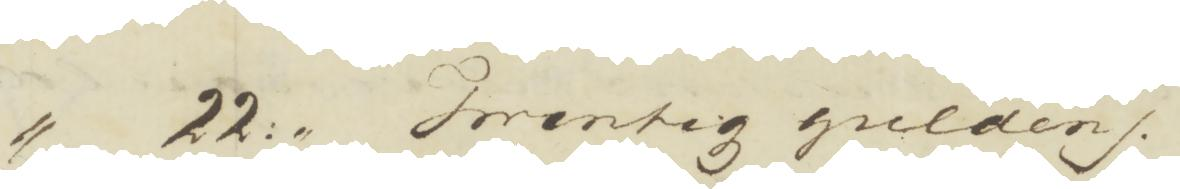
„ 22:„ twintig guldens.
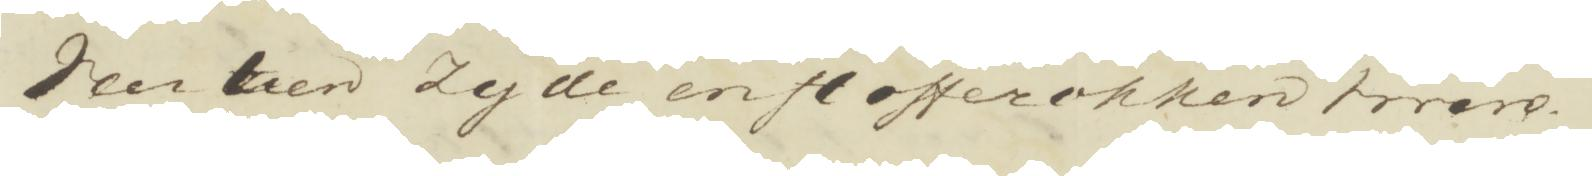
Veer tien zyde en stofferokken twin.
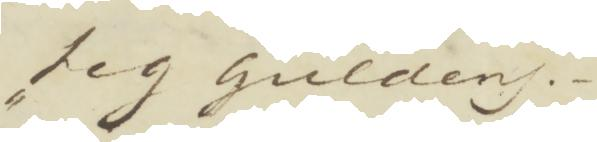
tig guldens.-
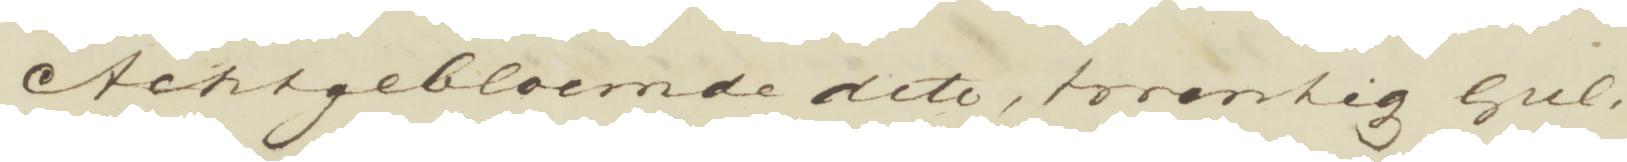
Acht gebloemde dito, twintig Gul,
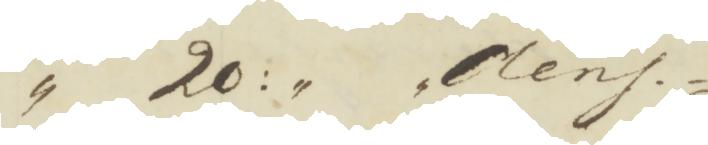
„ 20: „ „ dens.-
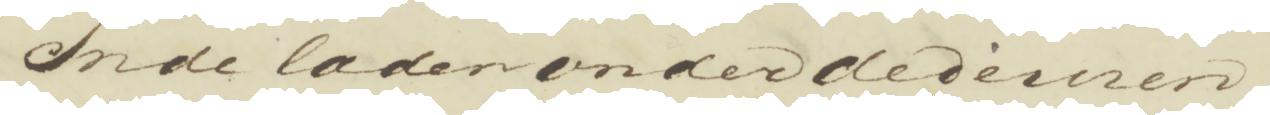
In de laden onder de deuren
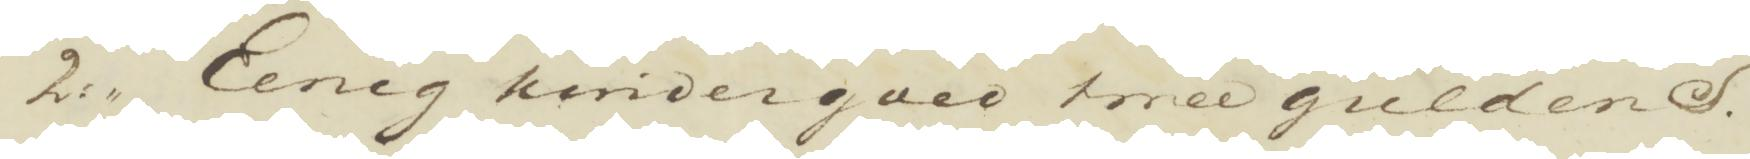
2:„ Eenig kinder goed twee guldens.
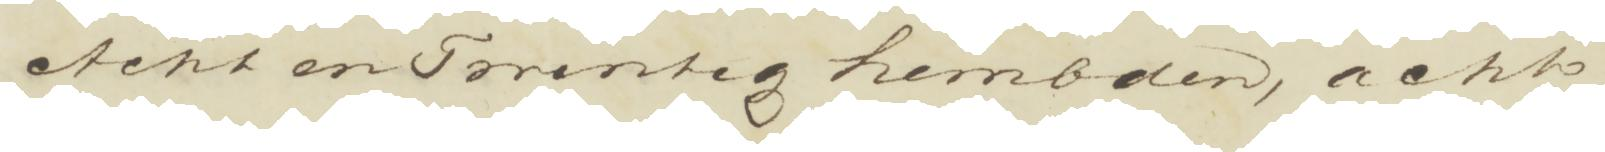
Acht en Twintig hembden, acht
